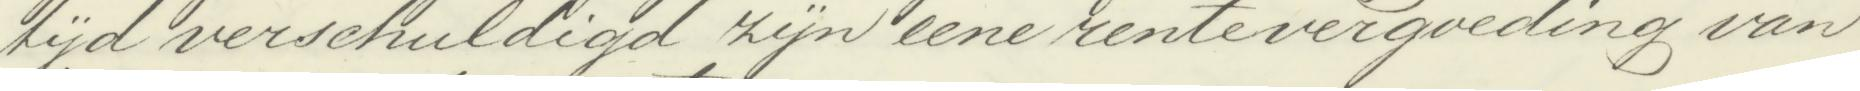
tijd verschuldigd zijn eene rente vergoeding van
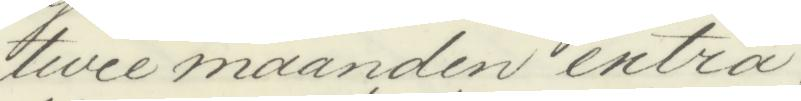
twee maanden extra
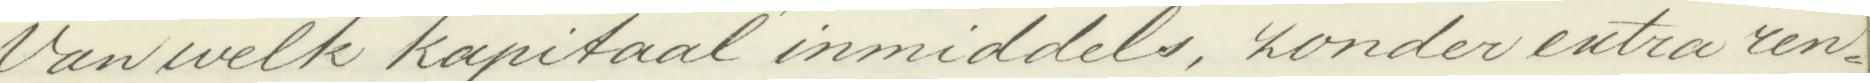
Van welk kapitaal inmiddels, zonder extra ren=
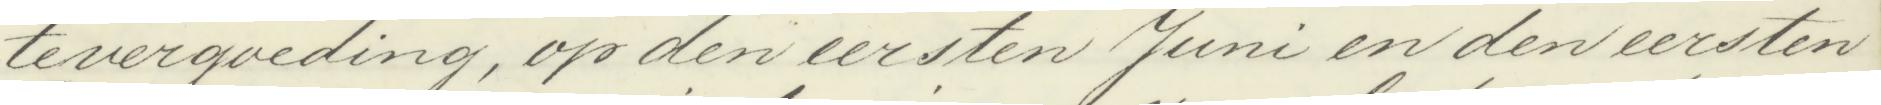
tevergoeding, op den eersten Juni en den eersten
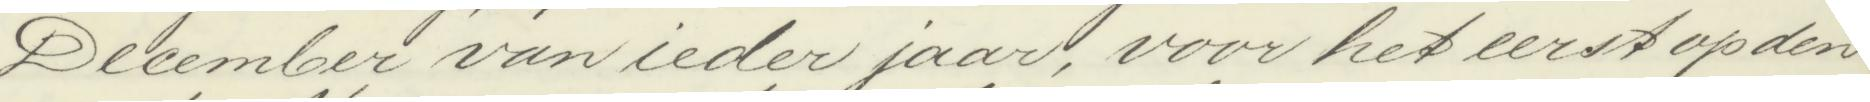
December van ieder jaar, voor het eerst op den
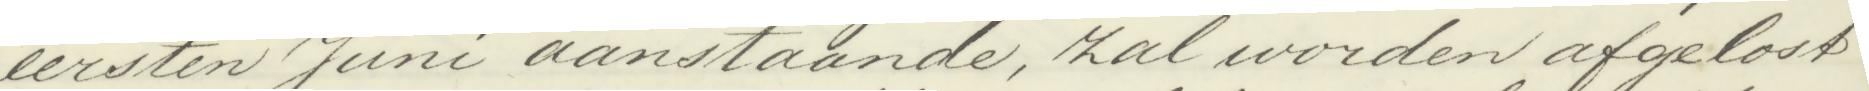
eersten Juni aanstaande, zal worden afgelost
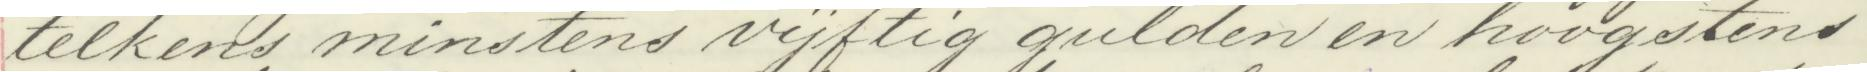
telkens minstens vijftig gulden en hoogstens
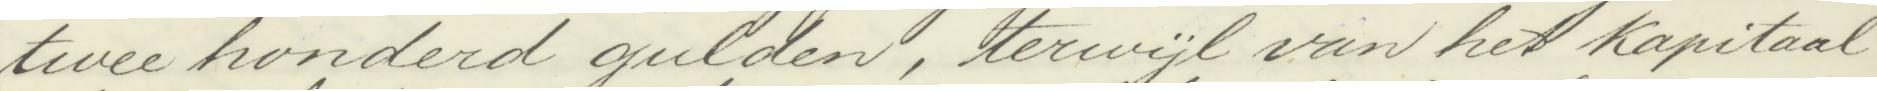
twee honderd gulden, terwijl van het kapitaal
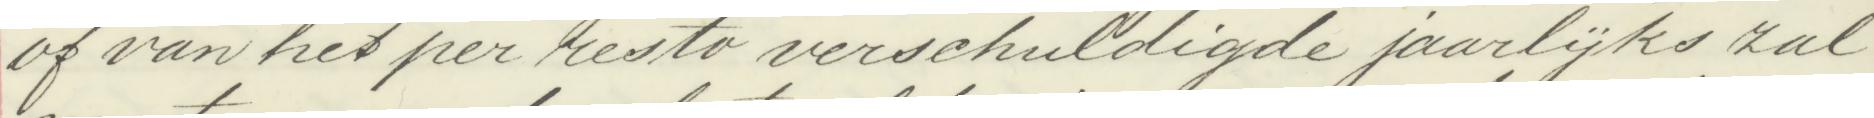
of van het per resto verschuldigde jaarlijks zal
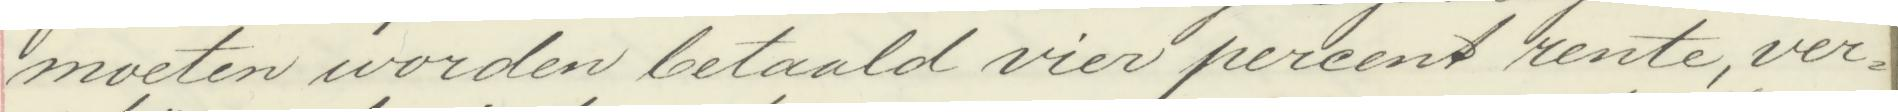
moeten worden betaald vier percent rente, ver=
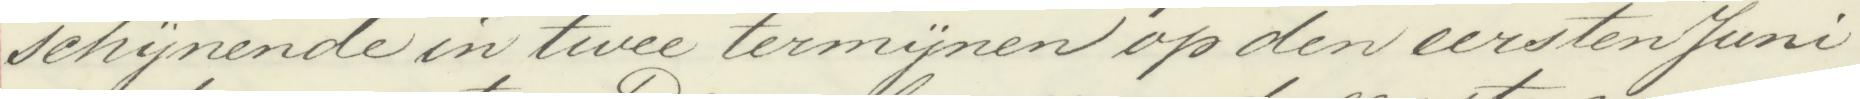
schijnende in twee termijnen op den eersten Juni
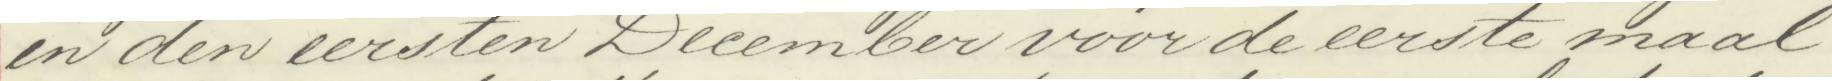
en den eersten December voor de eerste maal
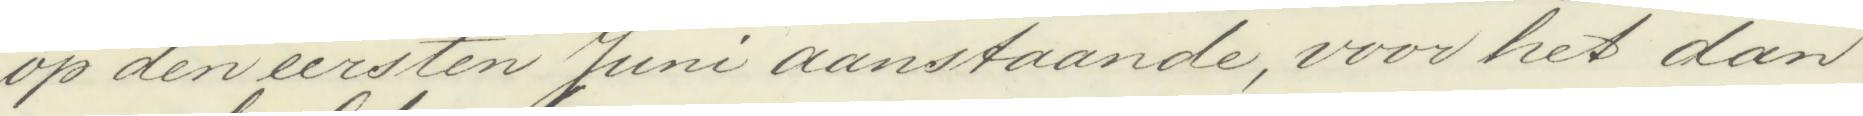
op den eersten Juni aanstaande, voor het dan
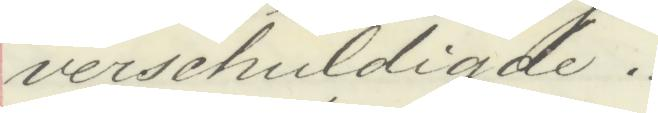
verschuldigde.
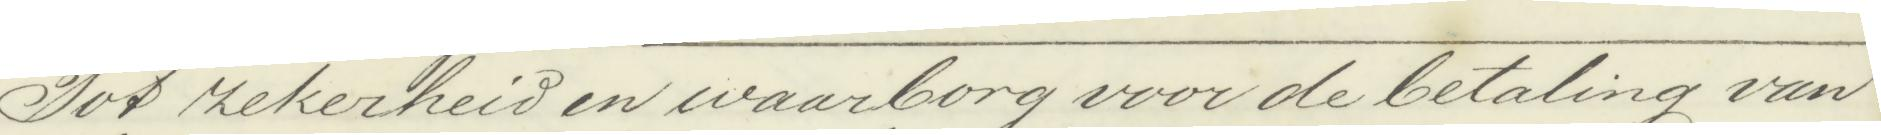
Tot zekerheid en waarborg voor de betaling van
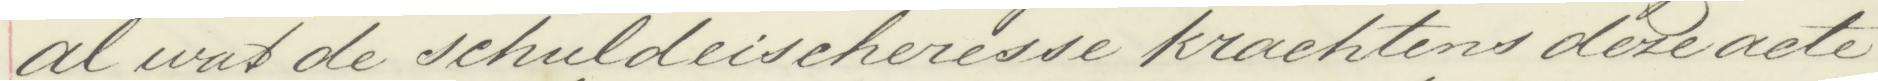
al wat de schuldeischeresse krachtens deze acte
